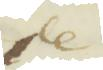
d:e
